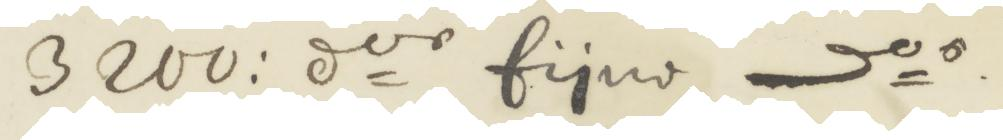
3200: D=os fijne D=os.
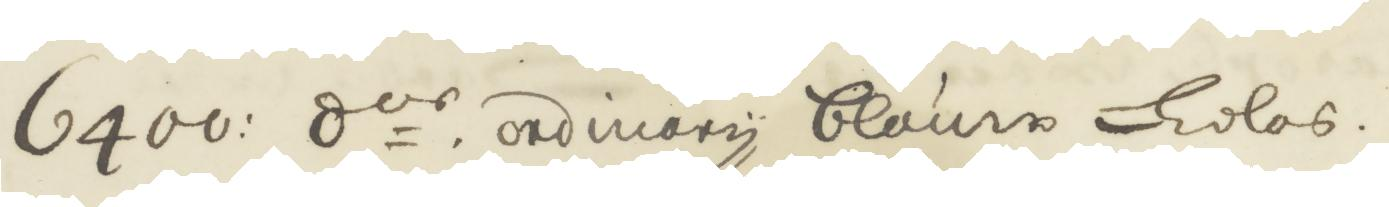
6400: D=os. ordinarij blauw Chelos.
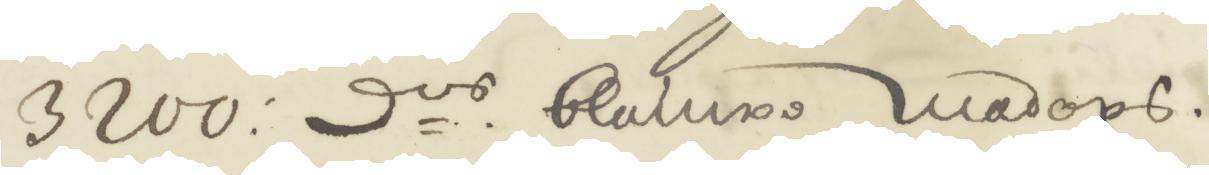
3200: D=os blauwe madops.
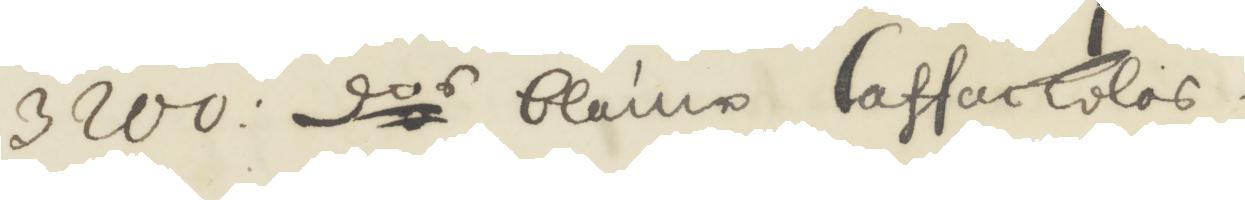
3200: D=os blauw taffachelos
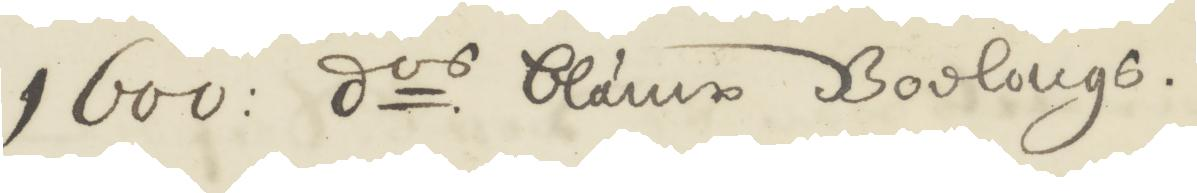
1600: D=os. blauw Boelongs.
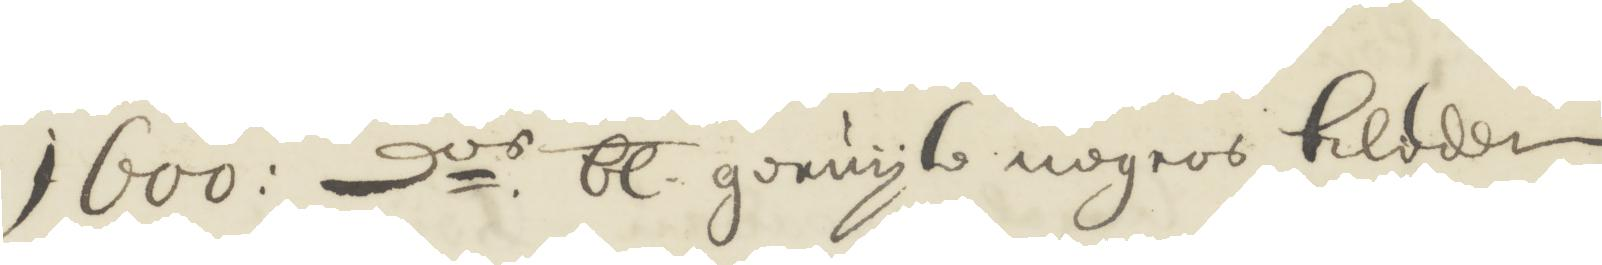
1600: D=os bl. geruijt negros kleden
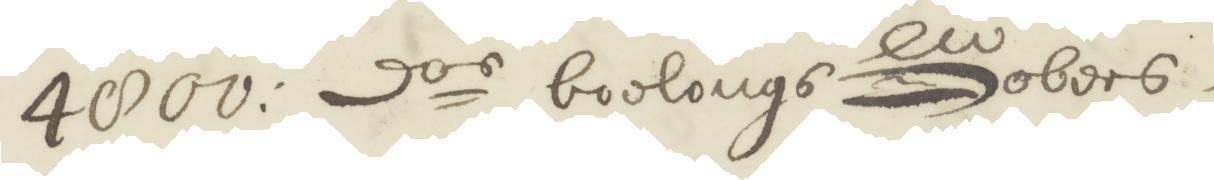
4800: D=os boelongs Gobers
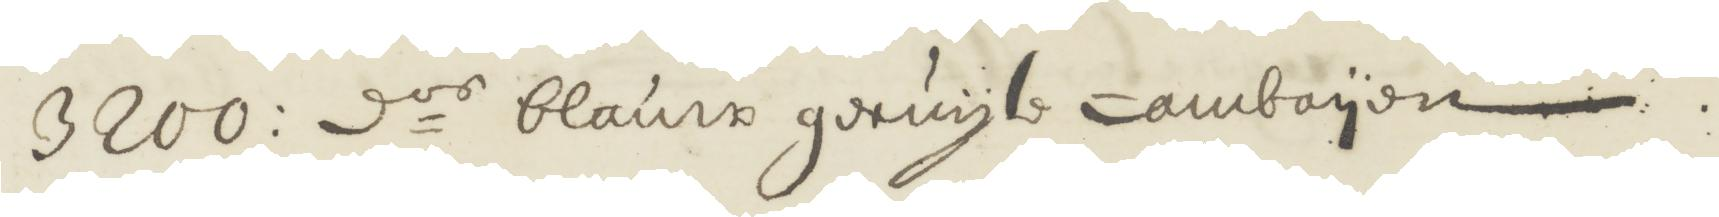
3200: D=os blauw geruijte cambaijen.
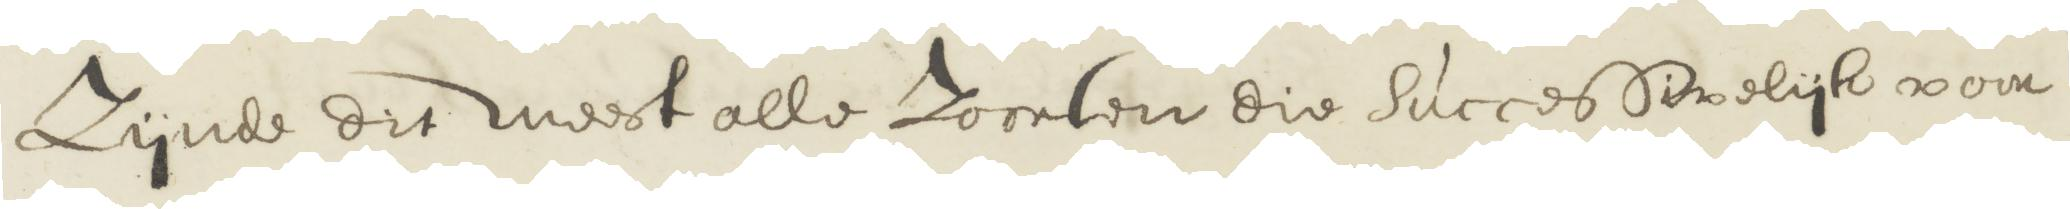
Zijnde dit meest alle Zoorten die successivelijk voor
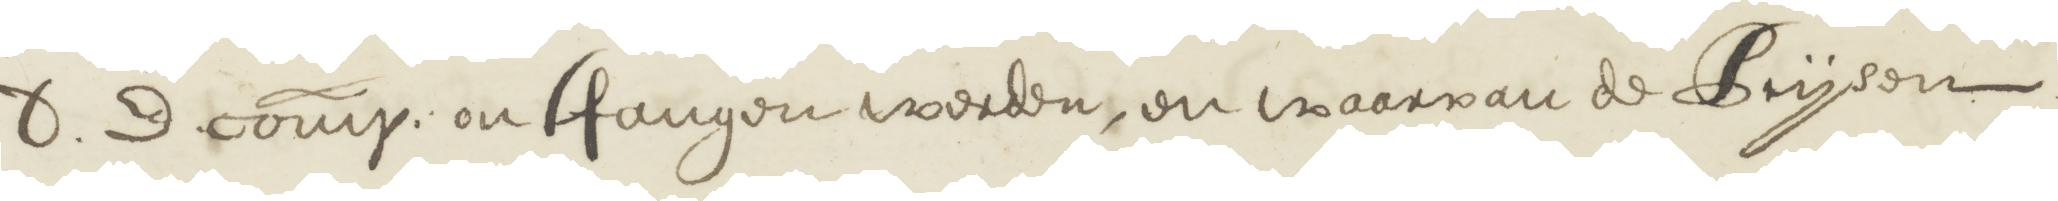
d. E comp: ontfangen werden, en waar van de Prijsen
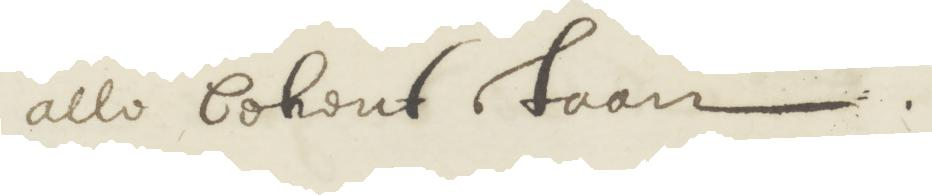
alle bekent staan.
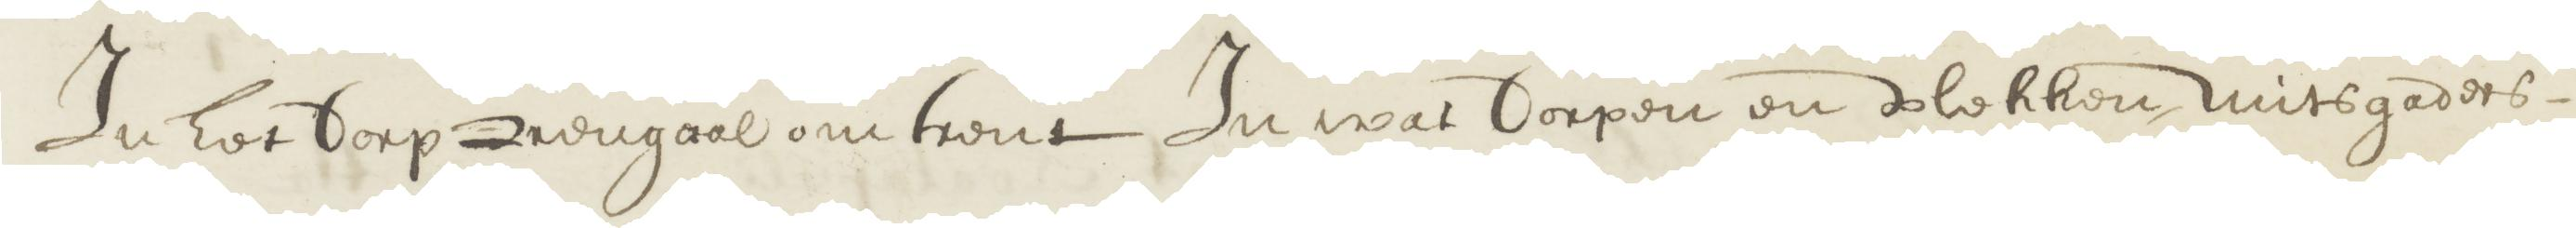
In het dorp Grengaal omtrent In wat dorpen en plekken mitsgaders
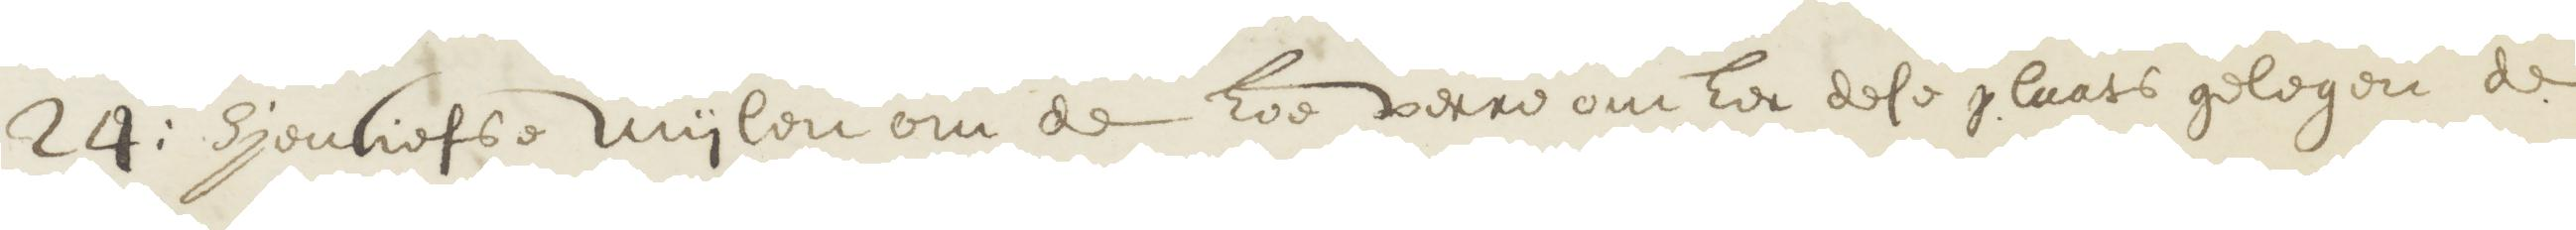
24: sjentiefse mijlen om de hoe verre om her dese plaats gelegen de
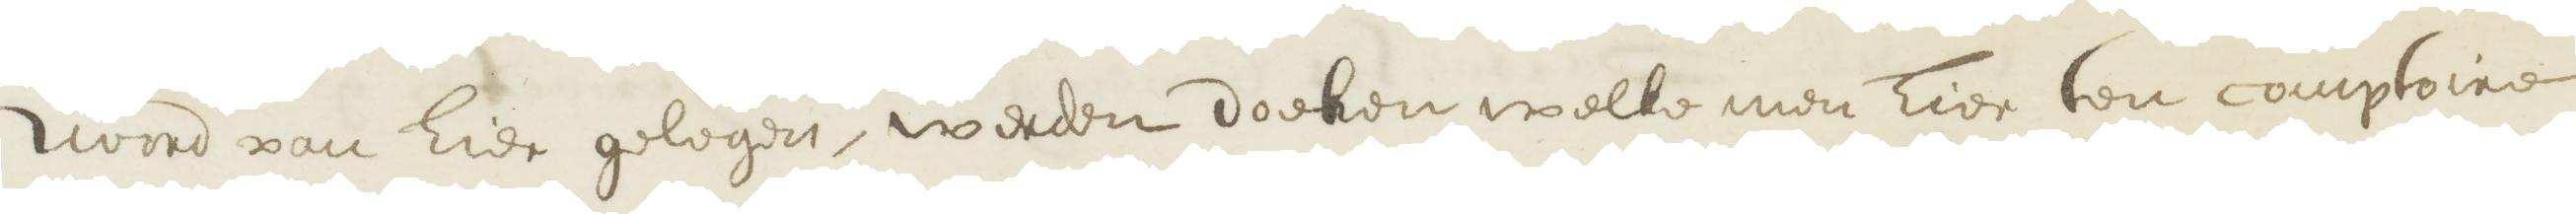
noord van hier gelegen, werden doeken welke men hier ten comptoire
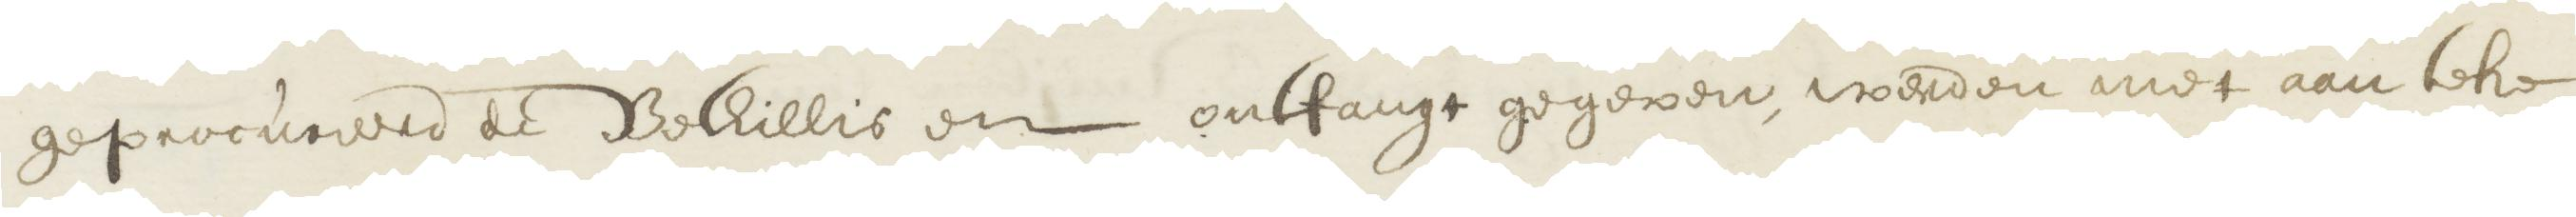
geprocuteerd de Bethillis en ontfangt gegeven, werden met aan teke
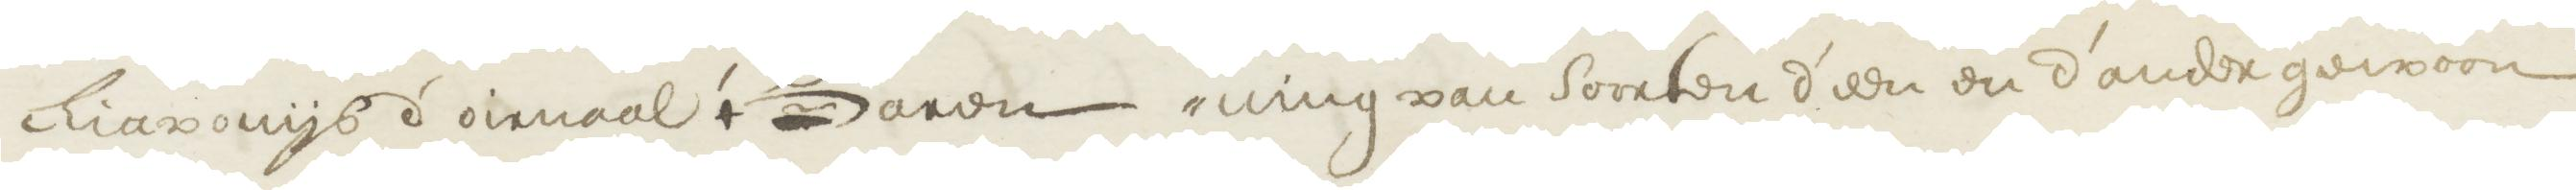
chiavonijs d’oirnaal ’t Garen „ning van Soorten d’ een en d’ander gewoon
